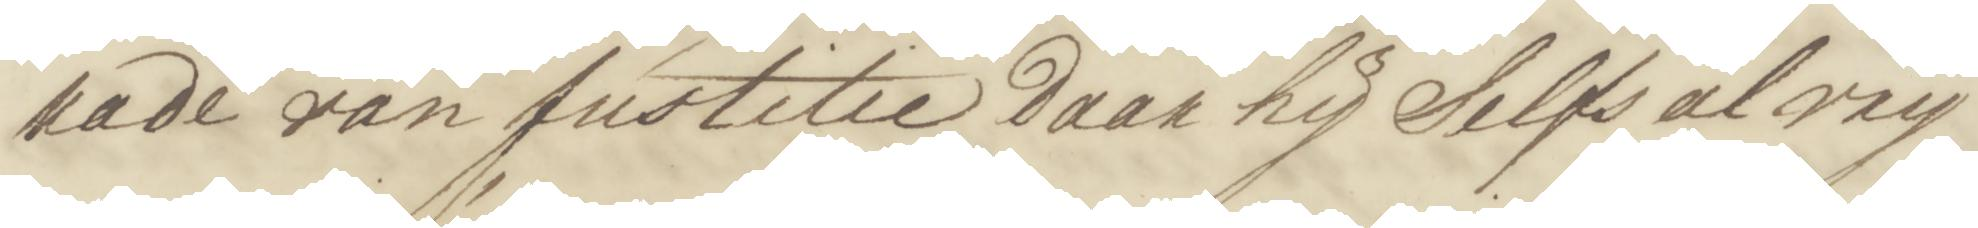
rade van Justitie, daar hij selfs al vrij
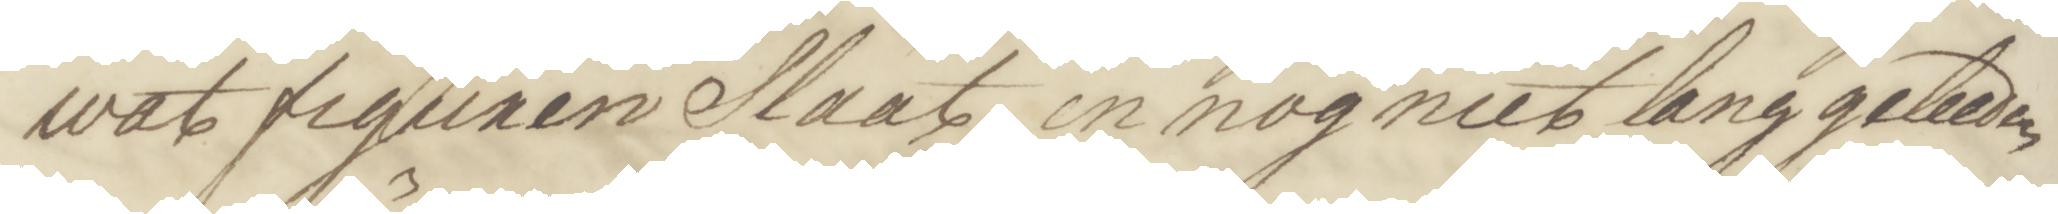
wat figuren slaat, en nog niet lang geleeden
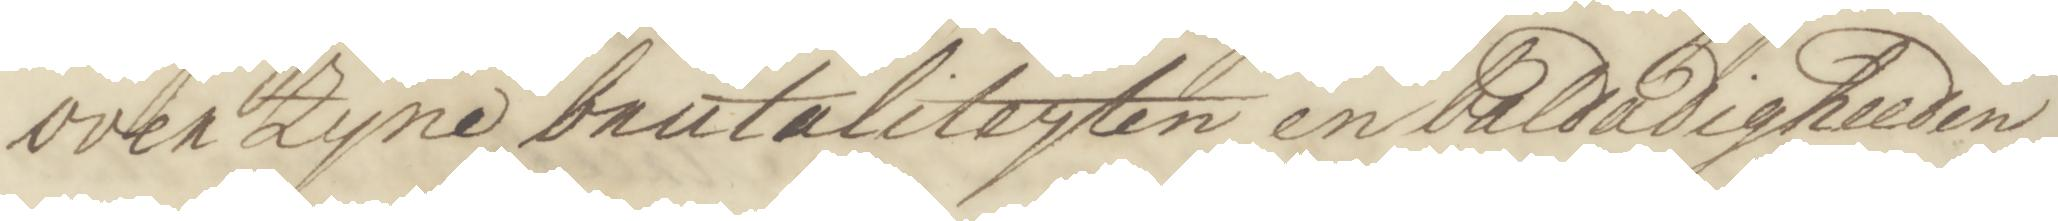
over zijne brutaliteijten en baldadigheeden
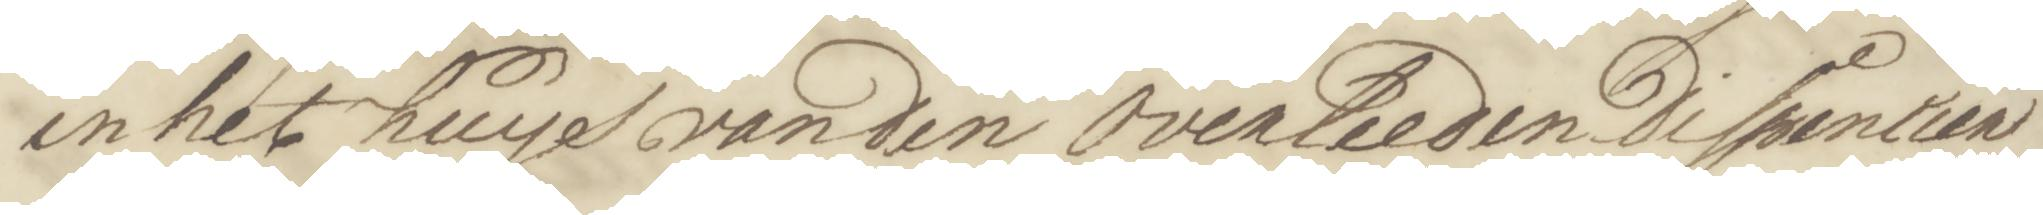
in het huijs van den overleeden dispencier
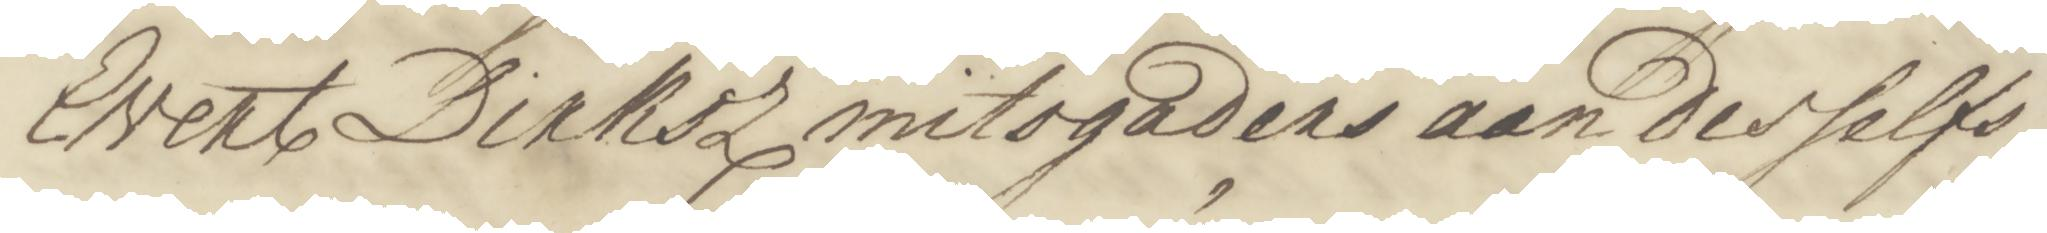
Evert Dirksz mitsgaders aan desselfs
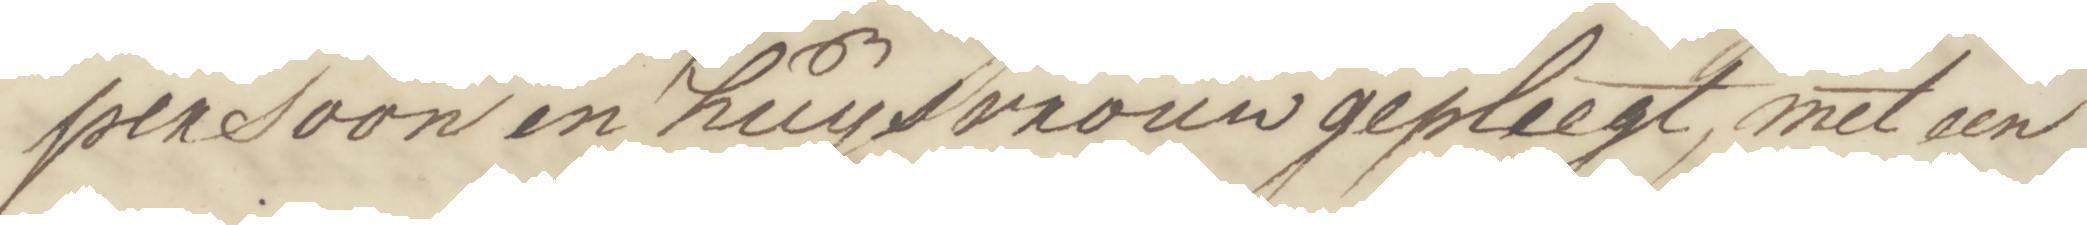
persoon en huijsvrouw gepleegt, met een
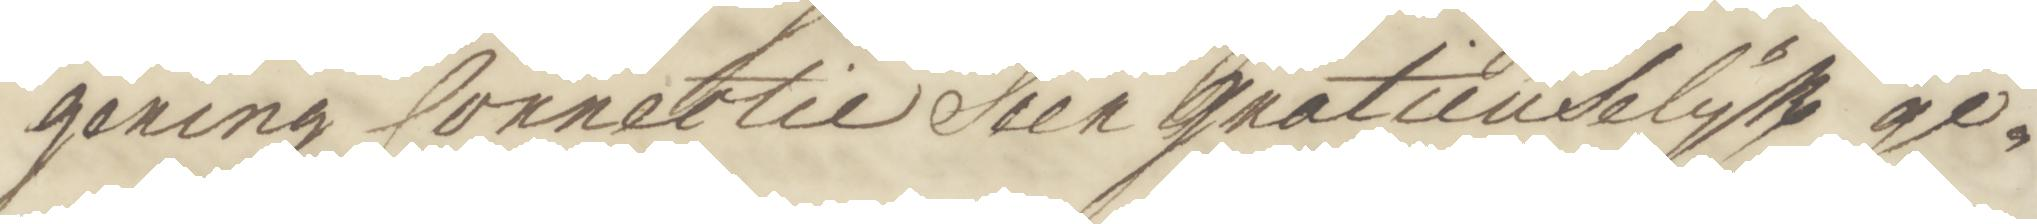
gering Correctie seer gratieuselijk ge„
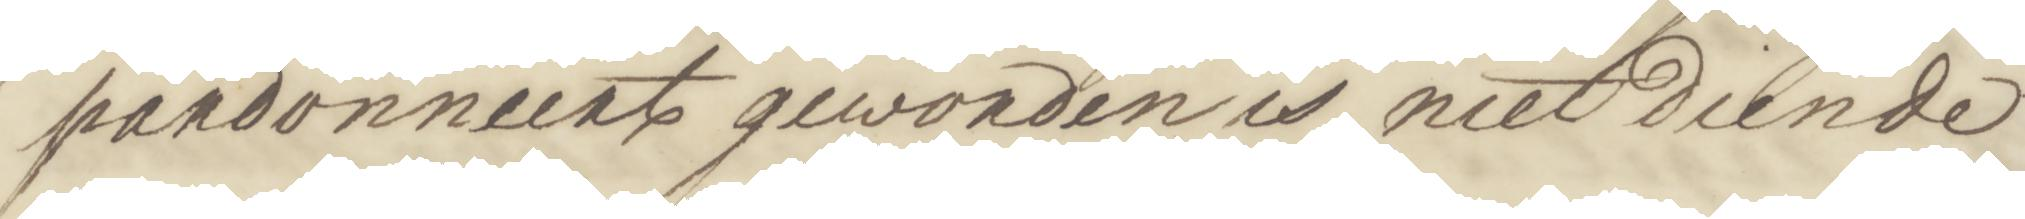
pardonneert geworden is, niet diende
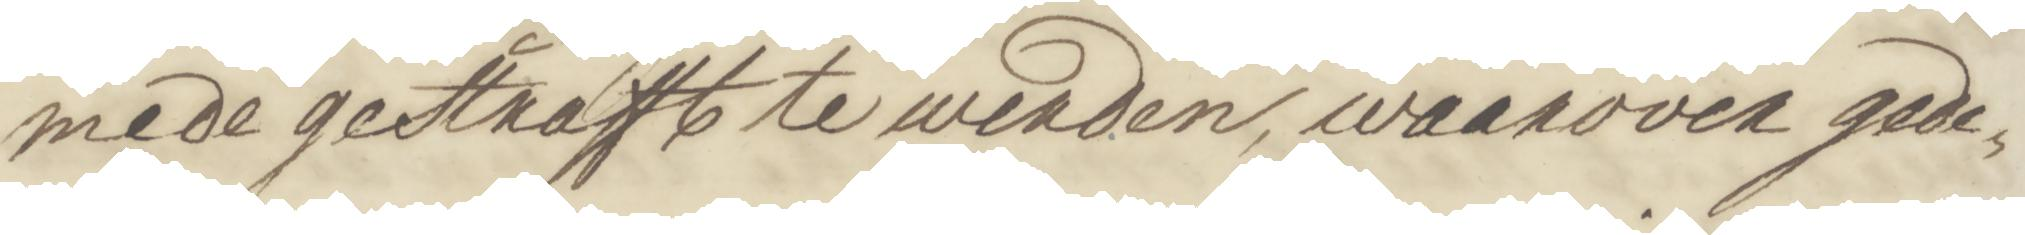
mede gestrafft te werden, waarover gede„
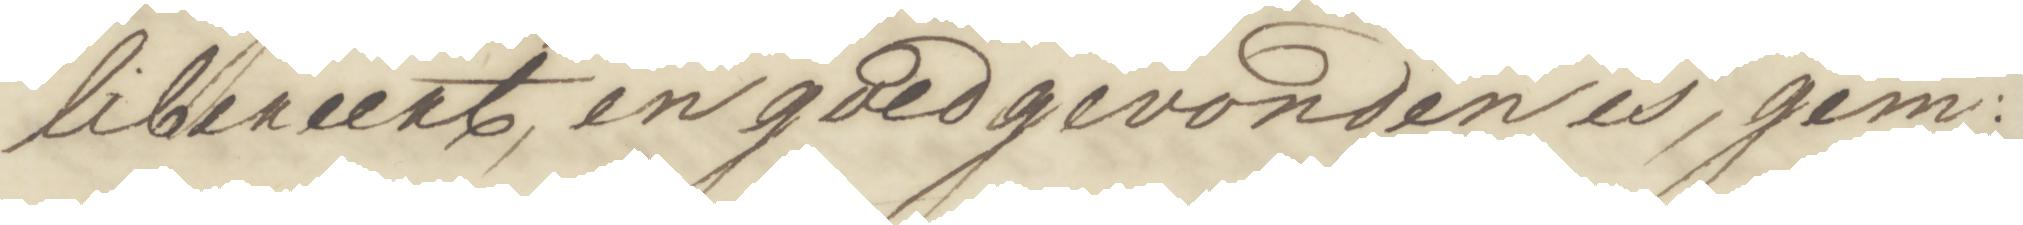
libereert, en goedgevonden is, gem:
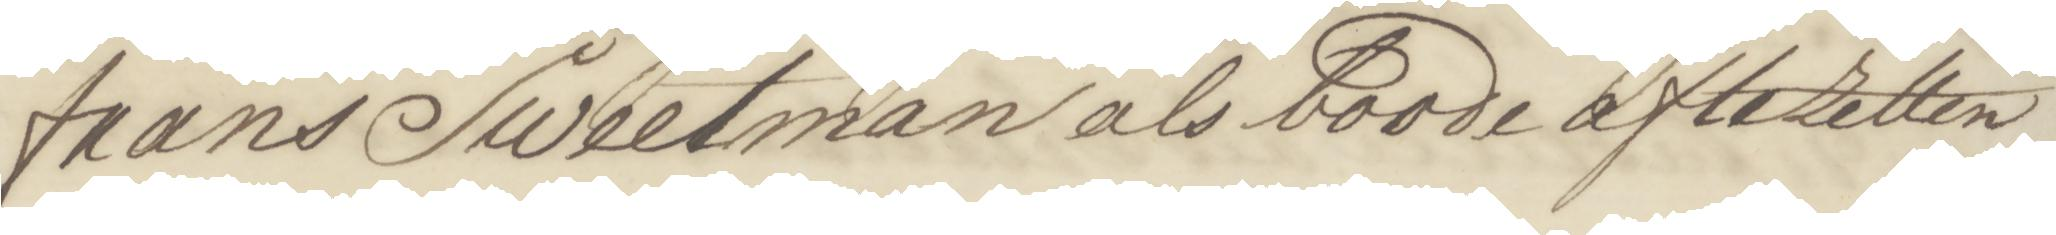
frans Sweetman als boode aftezetten
